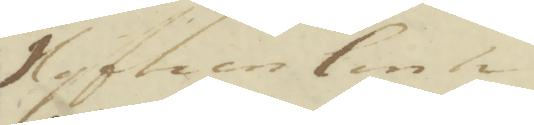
Vyftien Cents
